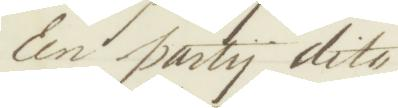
Een partij dito
